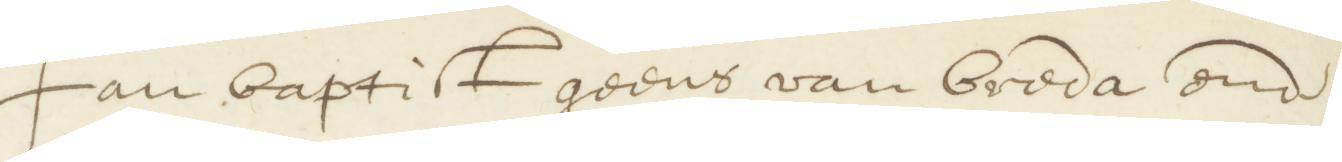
Jan baptist geens van breda ende
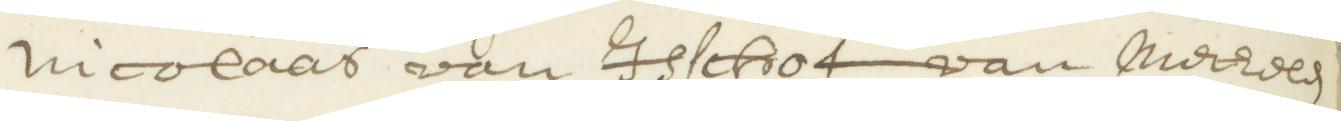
nicolaas van Isschot van mechelen
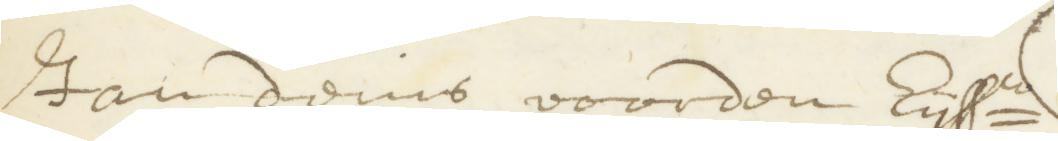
Ian deins voorden Eijss=r
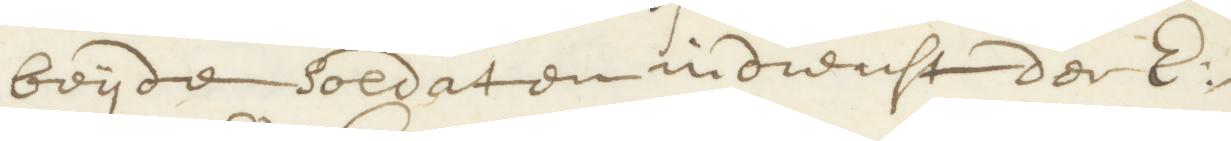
beijde soldaten in dienst der E:
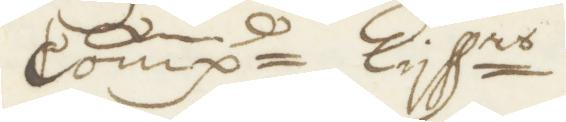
Comp=e Eijss=rs
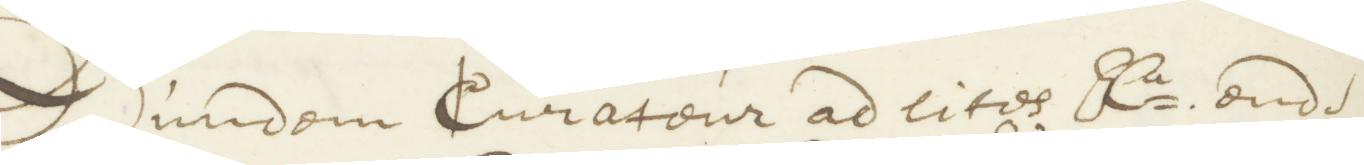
Eundem Curateur ad lites &=a. ende
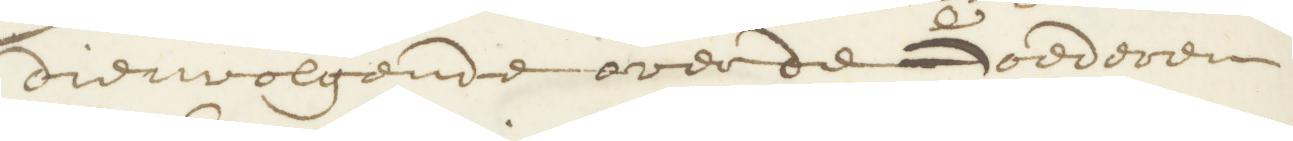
dienvolgende overde Goederen
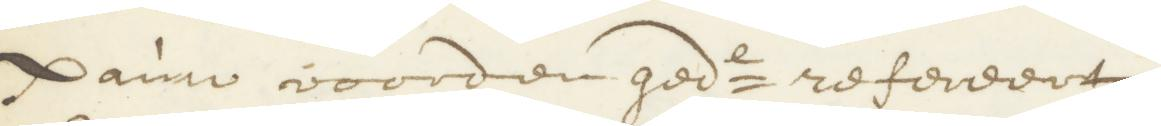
pauw voorden ged=e refereert
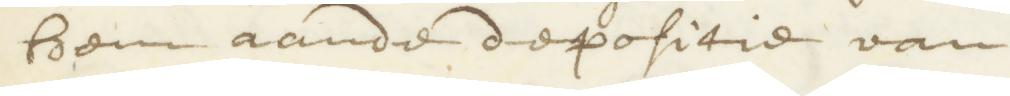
hem aande depositie van
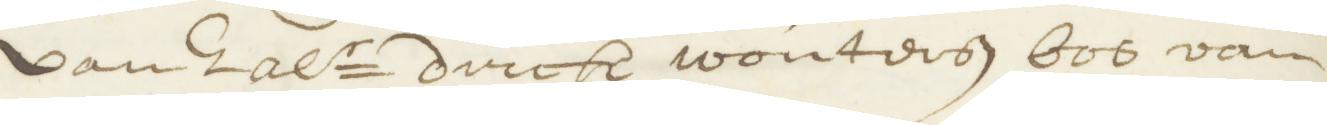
van zal=r dirck wouters bos van
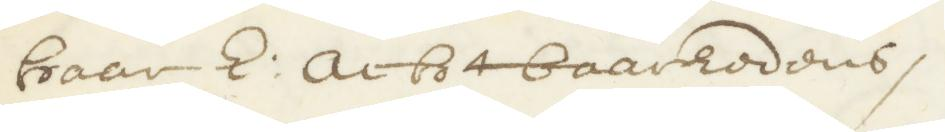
haar E: achtbaarhedens,
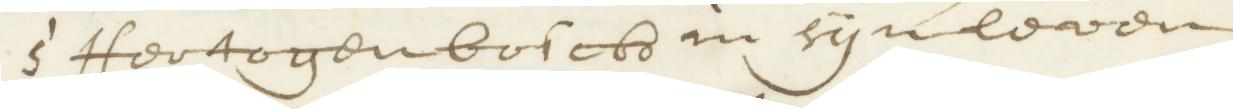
s' Hertogenbosch in sijn leven
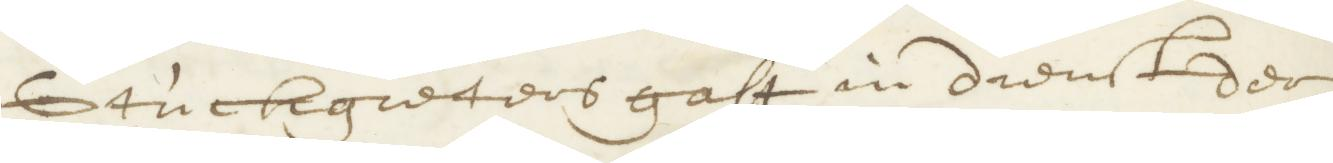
Stuckgieters gast in dienst der
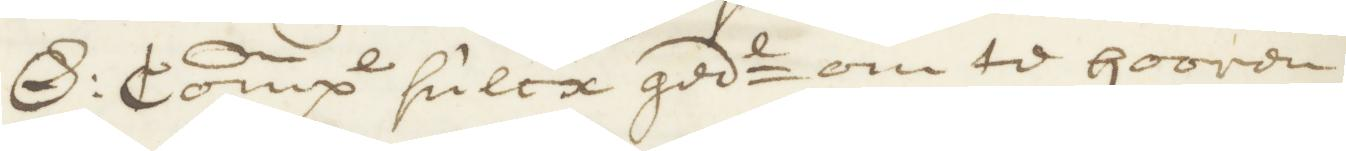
E: Compe sulcx ged=e om te hooren
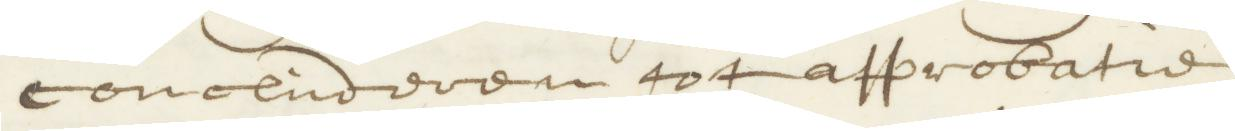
concluderen tot approbatie
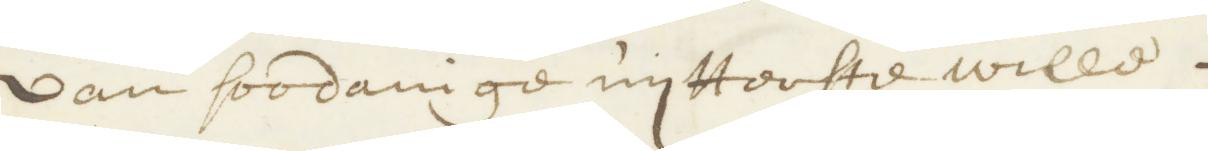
van soodanige uijtterste wille
